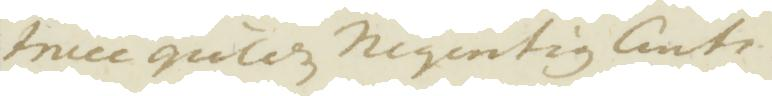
twee gulden Negentig Cents
